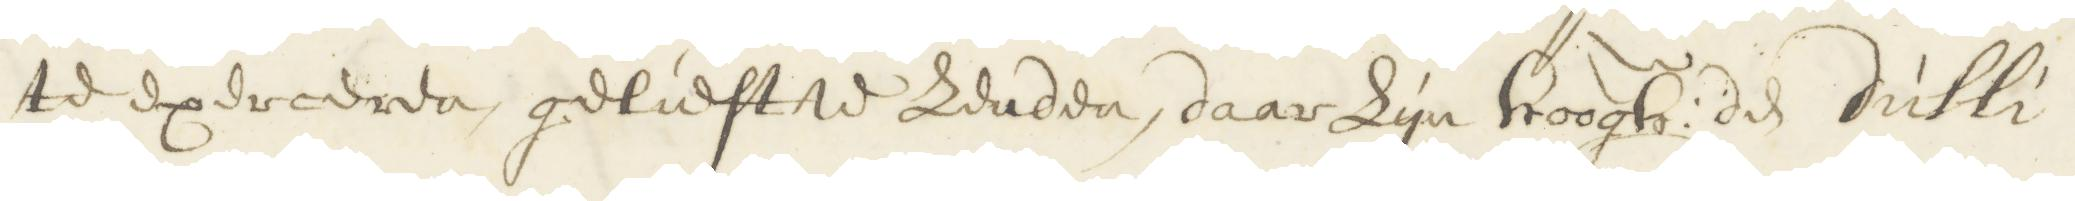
te exerceren, gelieft te zenden, daar zijn hoogh: den dulli
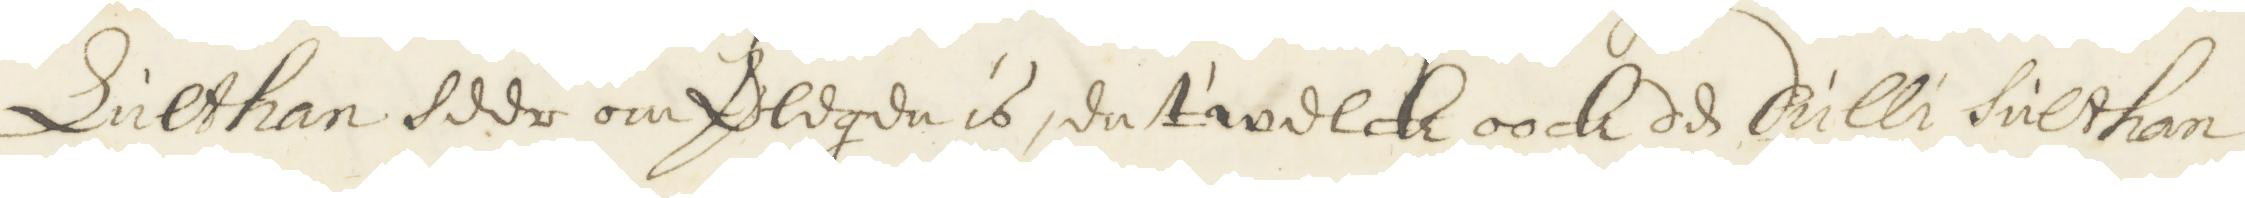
zulthan seer om verlegen is, en t'welck oock den dulli sulthan
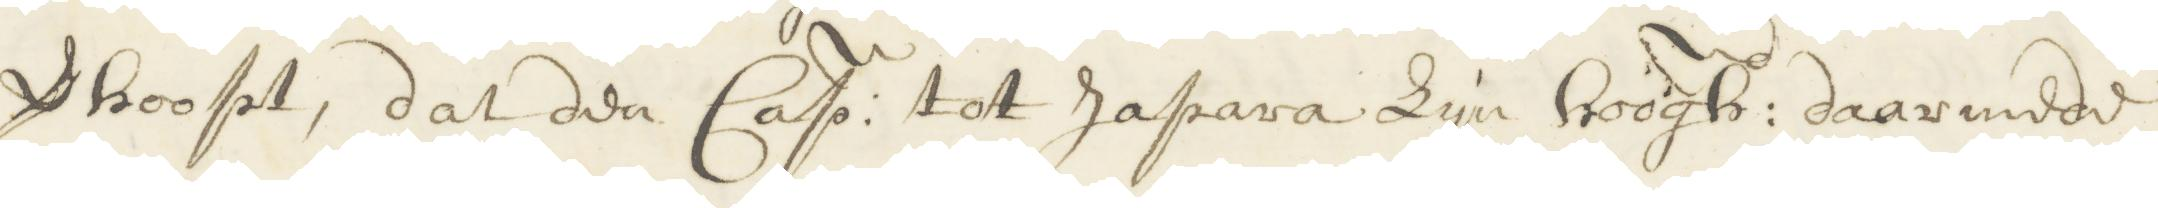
verhoopt, dat den Cap:n tot Japara zijn hoogh:d daar mede
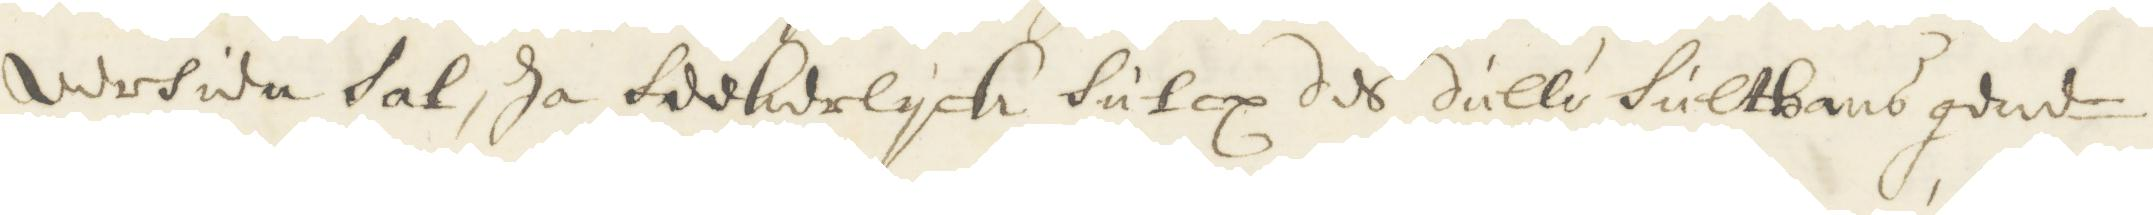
versien sal, Ja seekerlijck sulcx des dulli sulthans gene=
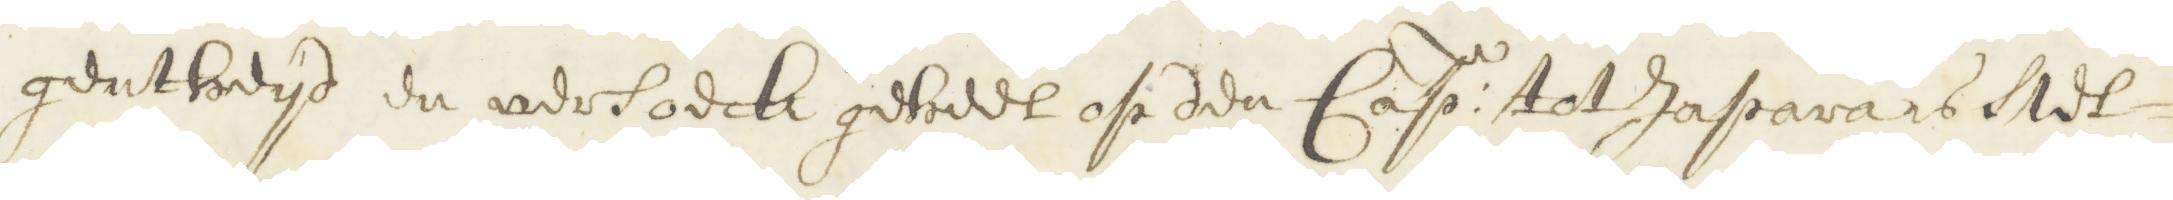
gentheijd en versoeck geheel op den Cap:n tot Japara is stel=
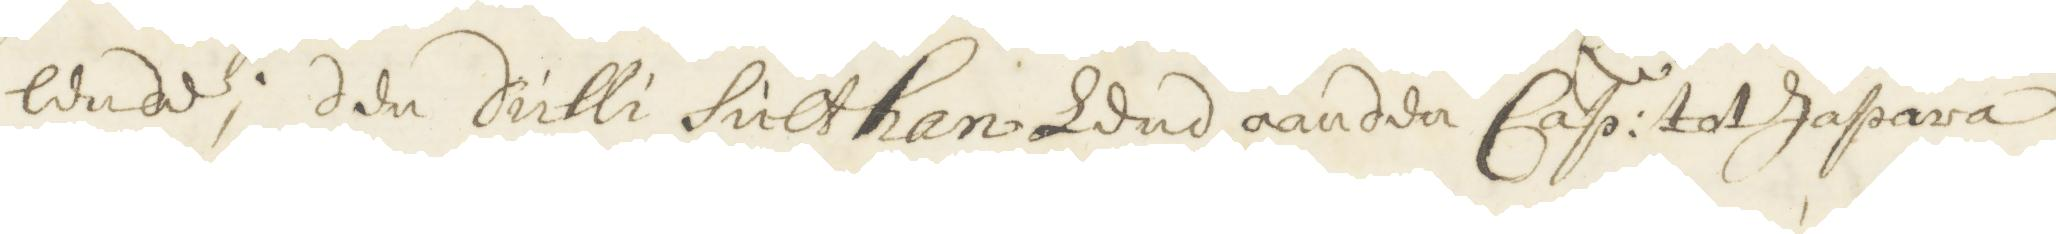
lende; den dulli sulthan zend aanden Cap:n tot Japara
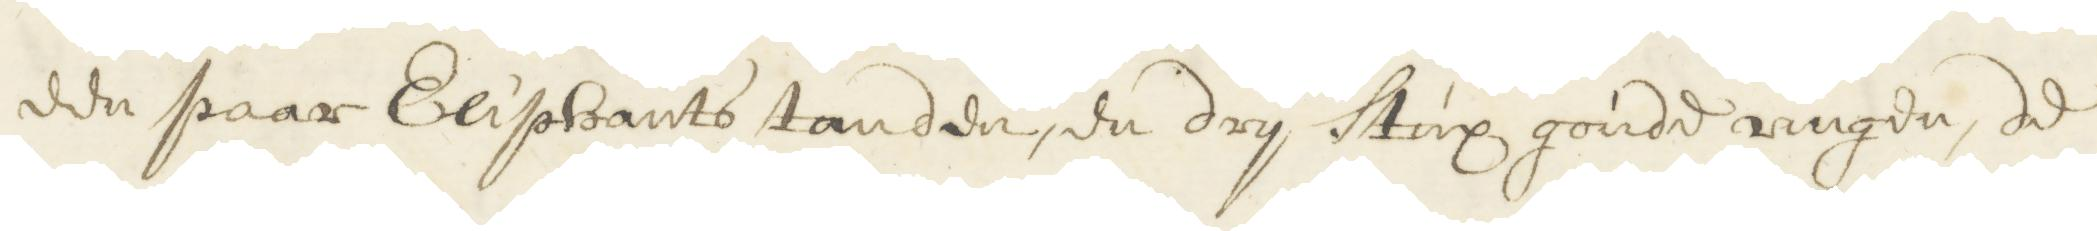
een paar Eliphants tanden, en drij stux goude ringen, de
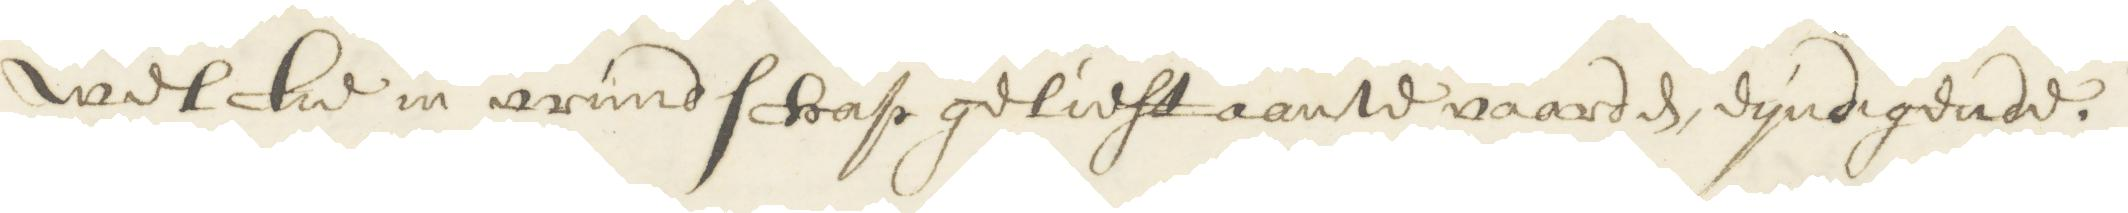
welcke in vrundschap gelieft aante vaarden, eijndigende.
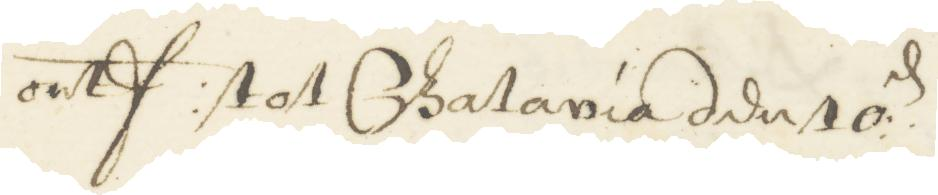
ontf: tot Batavia den 10:en
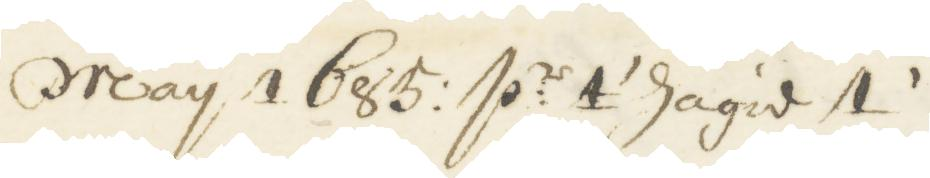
Maij 1685: p:r t' Jagie t
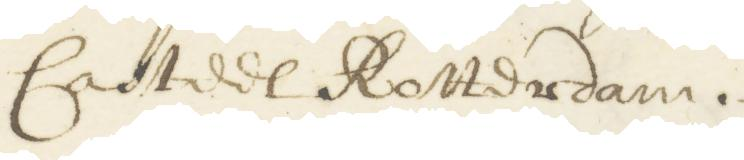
Casteel Rotterdam.
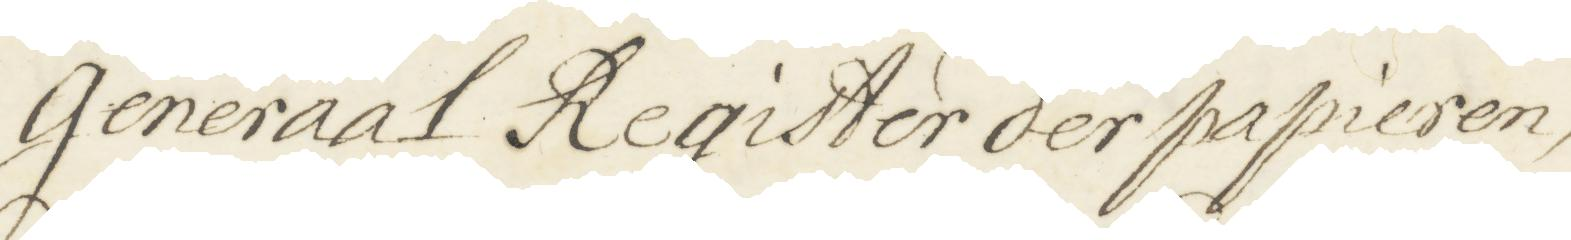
Generaal Register der papieren,
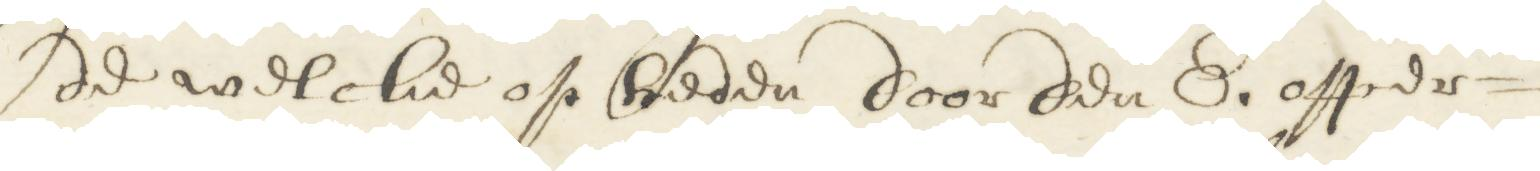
de welcke op heden door den E. opper=
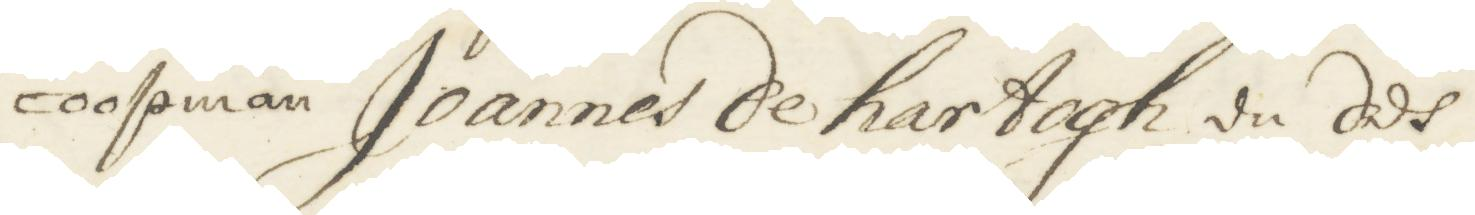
coopman Joannes de hartogh en des
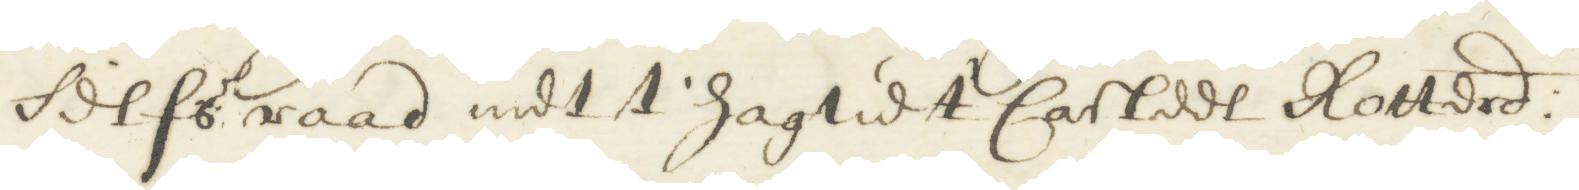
selfs: raad met t' Jagtie t' Casteel Rotterd:
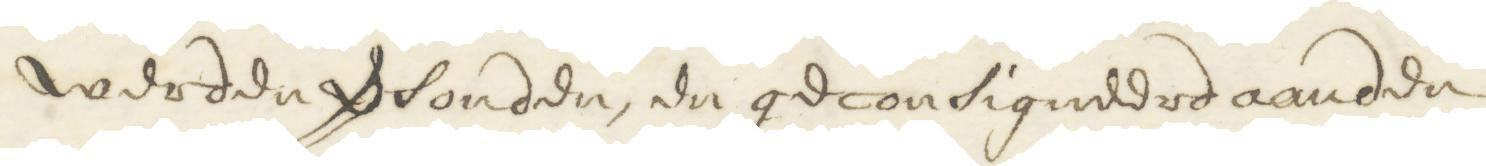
werden versonden, en geconsigneerd aanden
